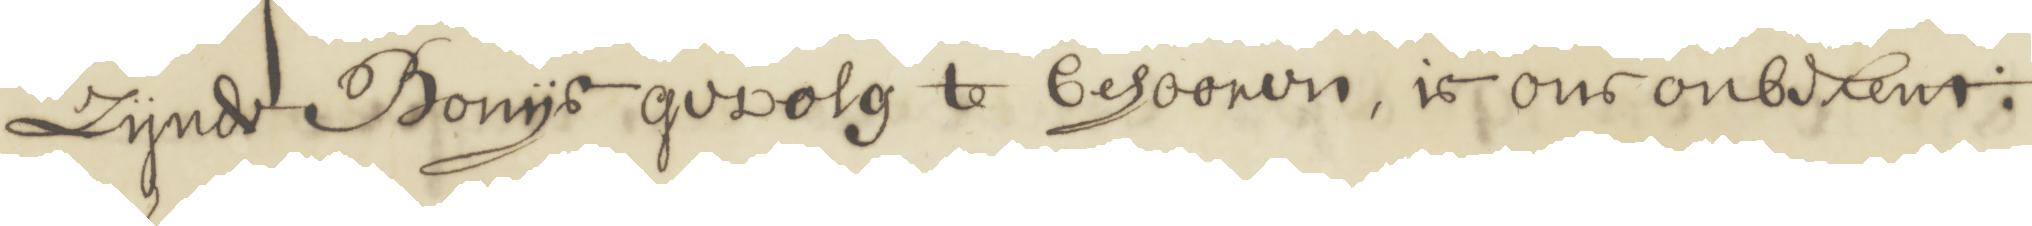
Zijnde Bonijs gevolg te behooren, is ons onbekent:
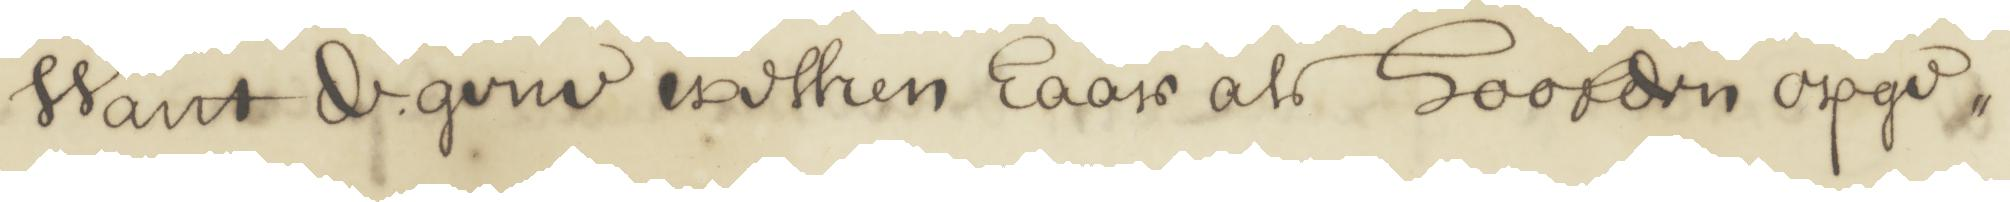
Want de gene welken haar als hoofden opge„
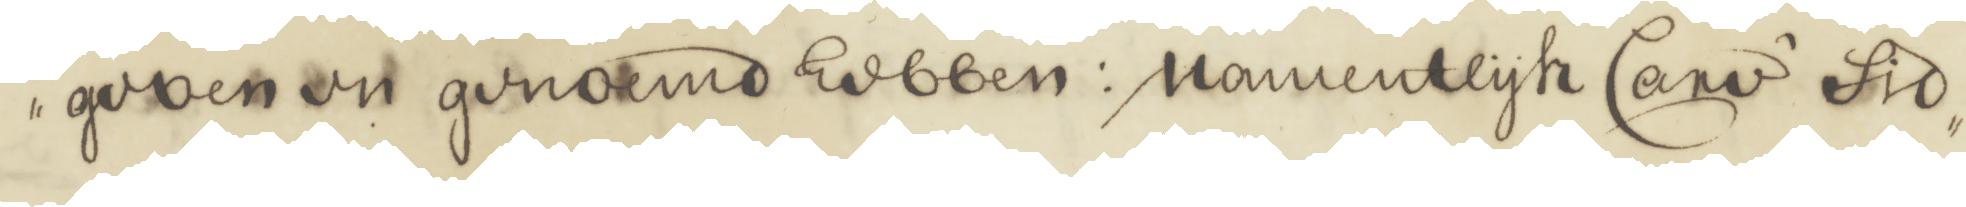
„geven en genoemd hebben: namentlijk Care Sid„
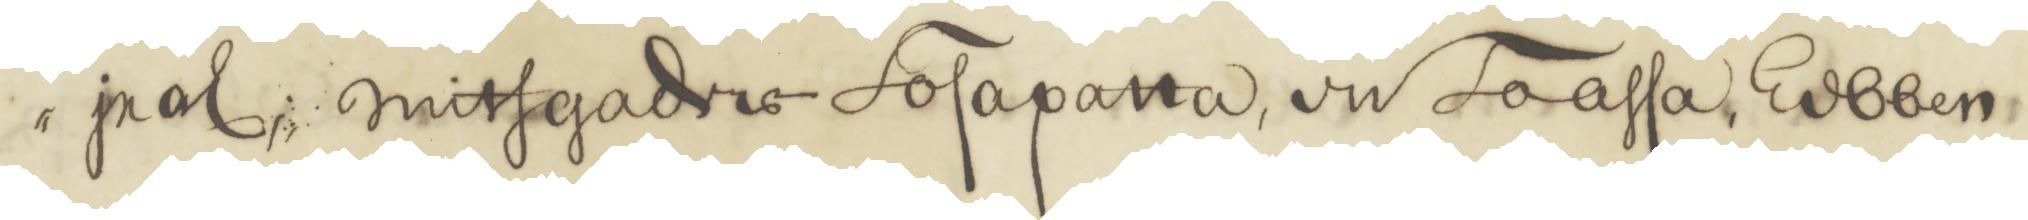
„jrah; mitsgaders Tosapatta, en Toassa, hebben
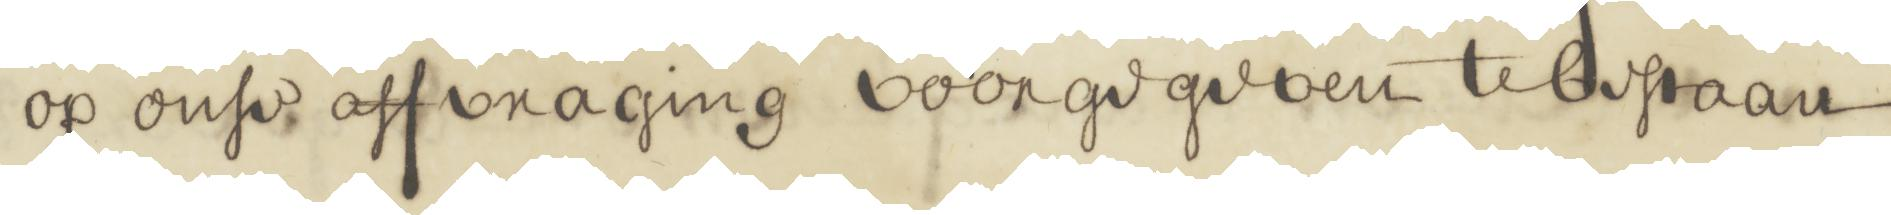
op onse affvraging voorgegeven te bestaan
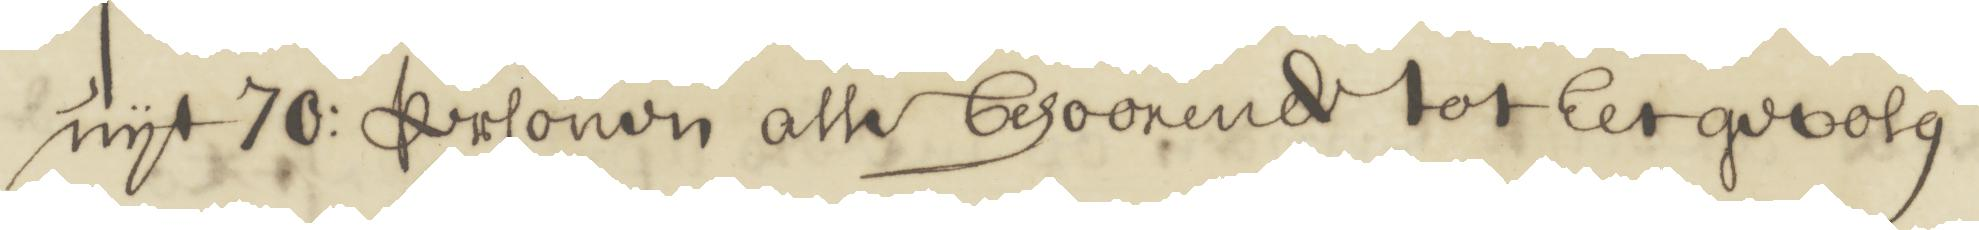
uijt 70: personen alle behoorende tot het gevolg
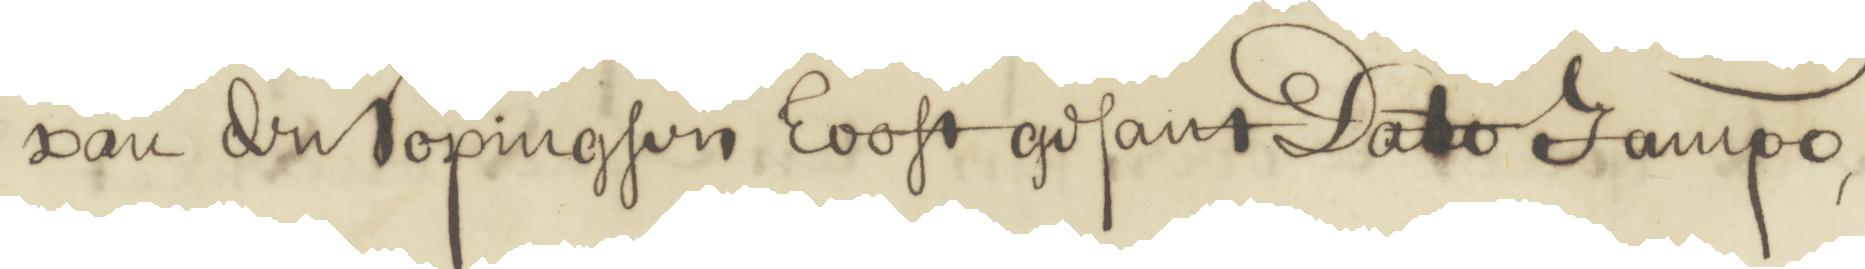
van den Sopingsen hooft gesant Dato Jampo,
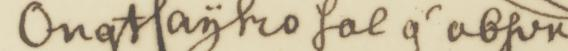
Ongtsaijko sal g'obser
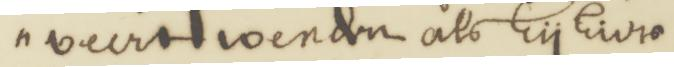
„veert werden als hij hier
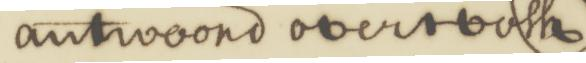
antwoord over 't volk
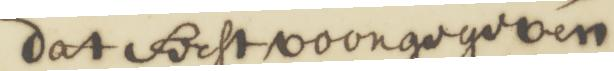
dat Eerst voorgegeven
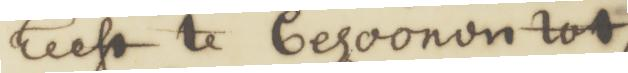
heeft te behooren tot„
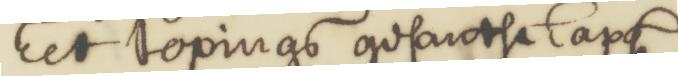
het Sopings gesantschaps
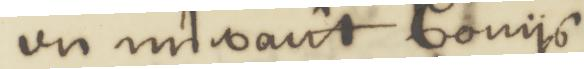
en nu van ’t bonijs
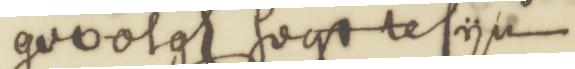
gevolgh segt te sijn
